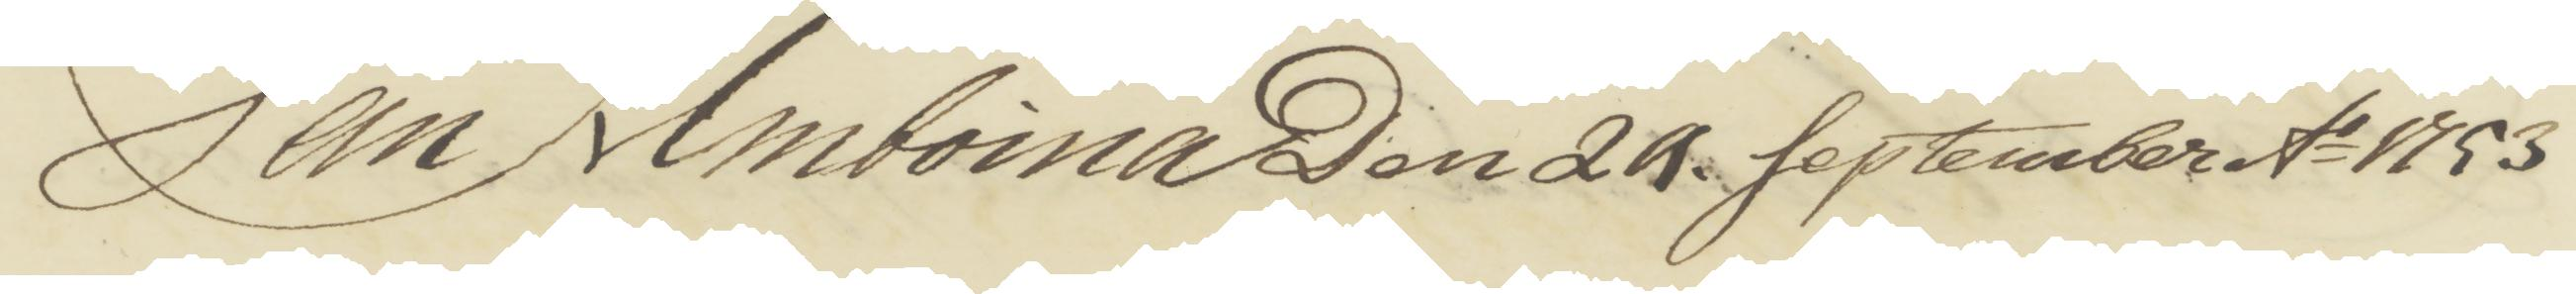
Van Amboina Den 24. september A=o 1753
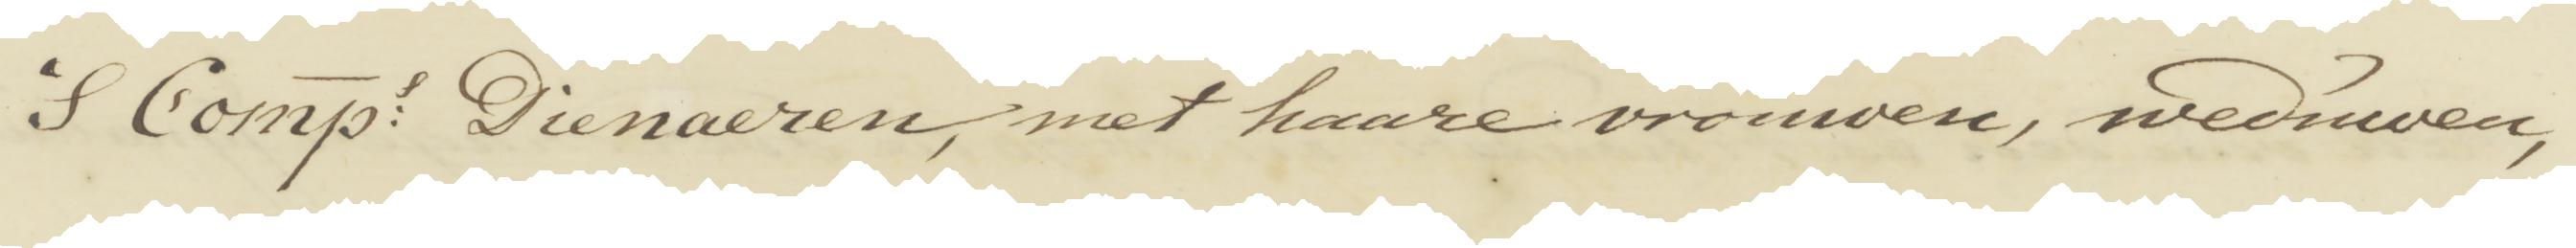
’s Comp:s Dienaeren, met haare vrouwen, weduwen,
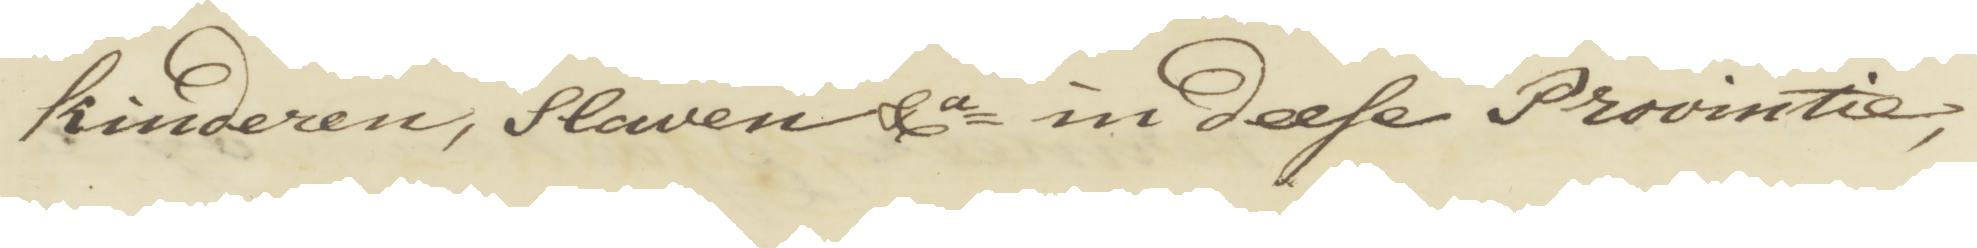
kinderen, slaven &=a in deese Provintie,
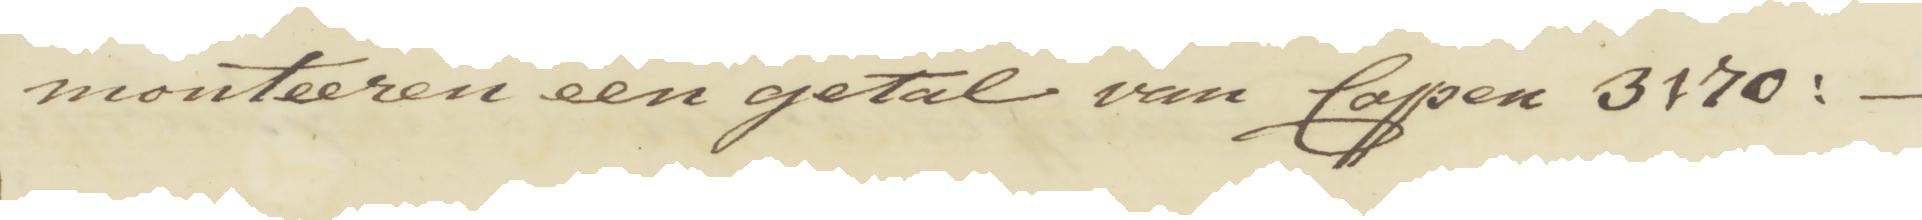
monteeren een getal van Coppen 3170: —
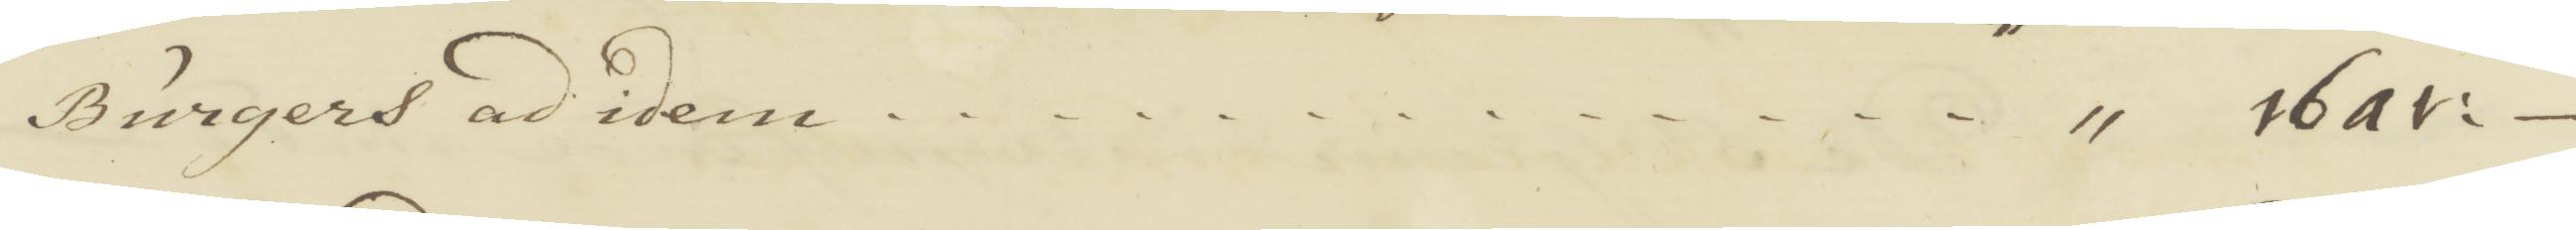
Burgers ad idem . . . . . . . . . . . . . „ 1641: —
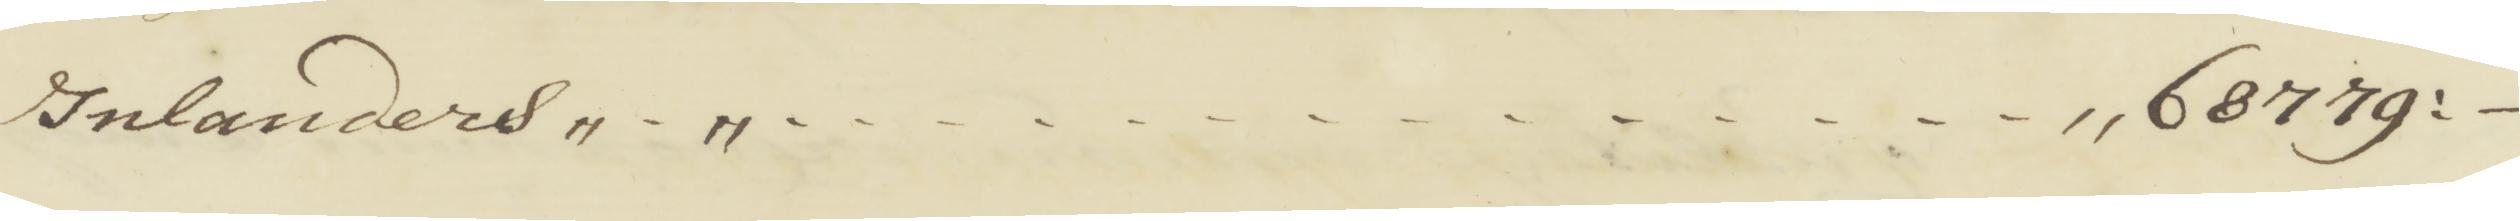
Inlanders „ - „ . . . . . . . . . . . . . . „ 68779: —
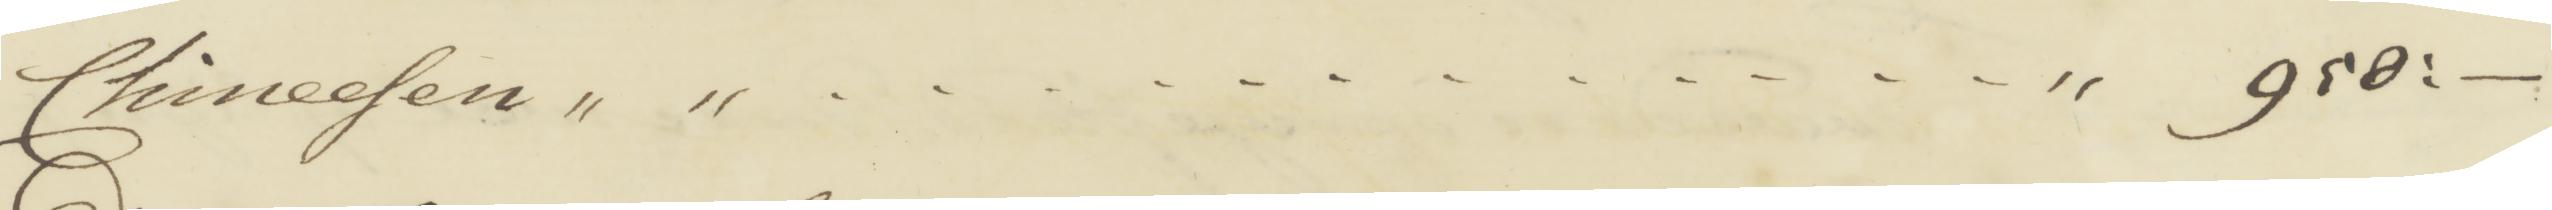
Chineesen „ „ . . . . . . . . . . . . . „ 958: —
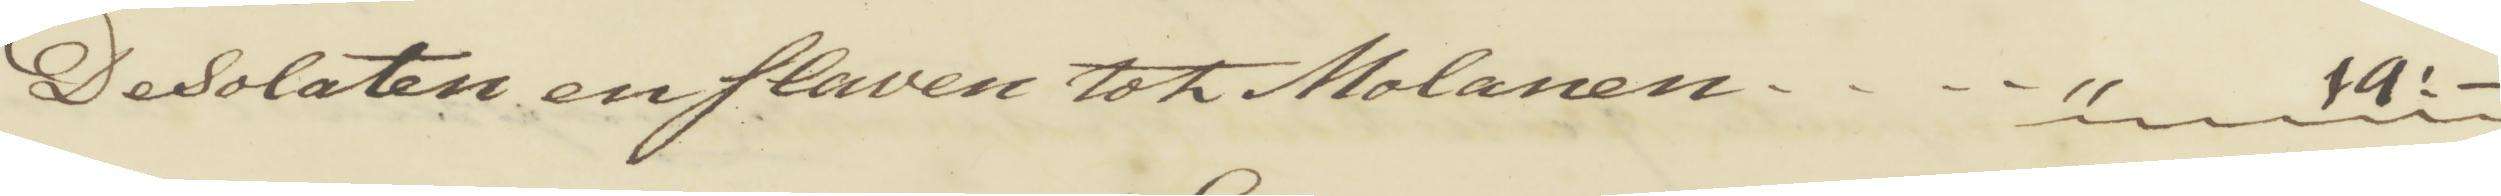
Desolaten en slaven tot Molanen . . . . „ 14: —
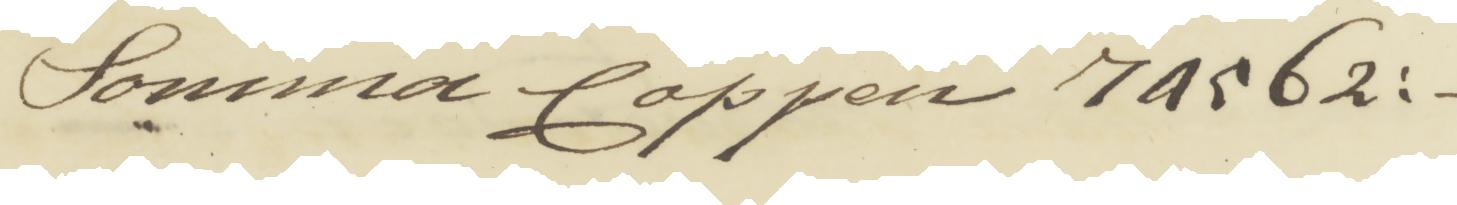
Somma Coppen 74562: —
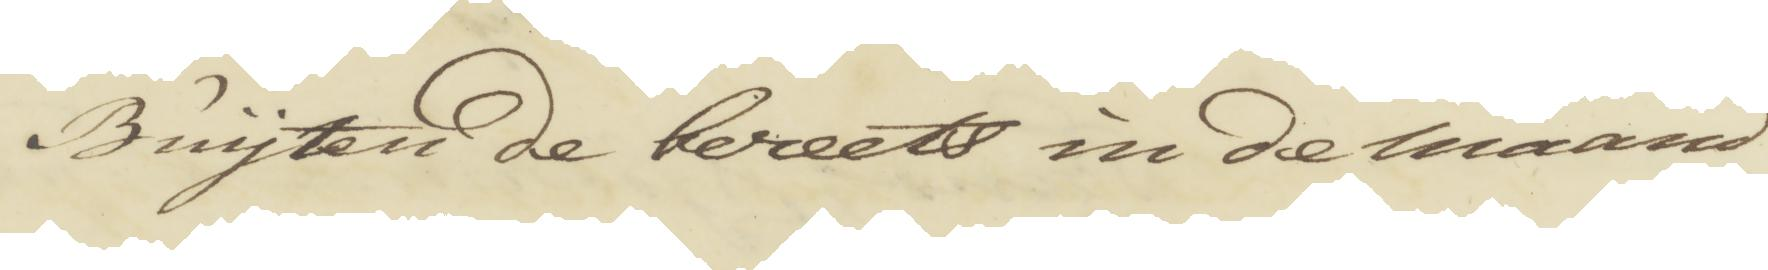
Buijten de bereets in de maand
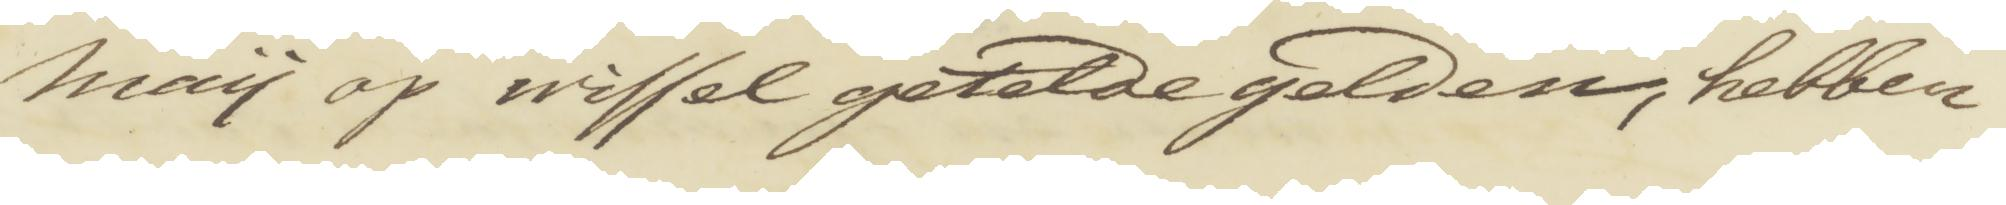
maij op wissel getelde gelden, hebben
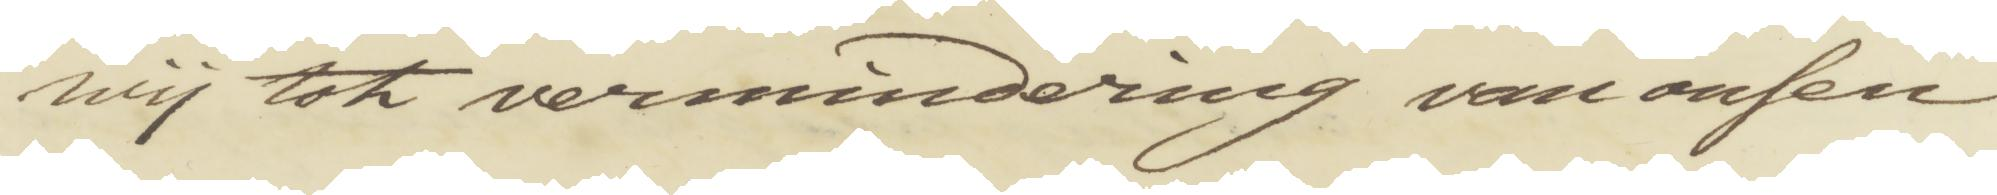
wij tot vermindering van onsen
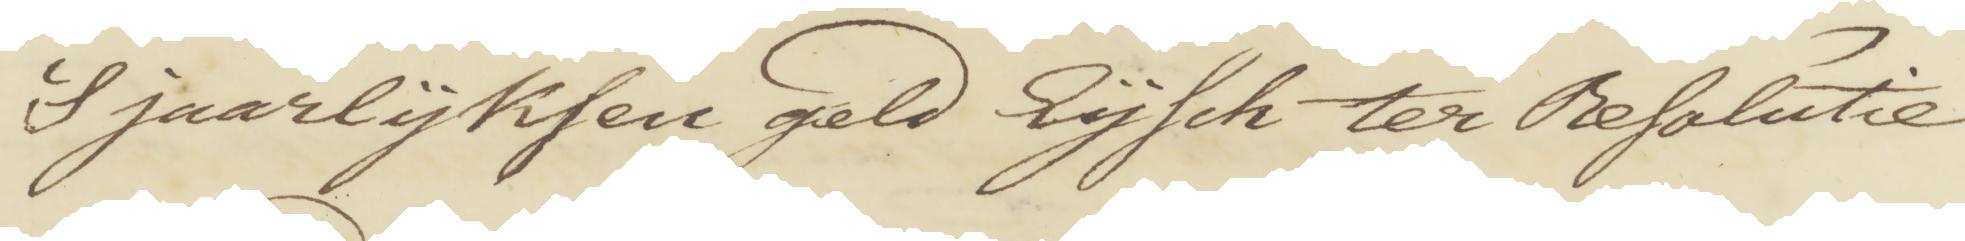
's jaarlijksen geld Eijsch ter Resolutie
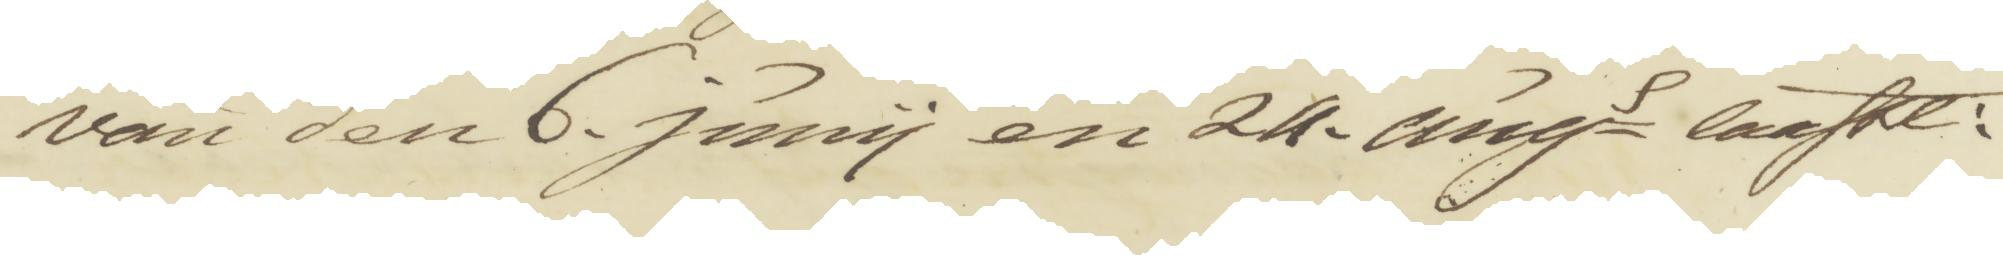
van den 6. Junij en 24. aug=s laastl:
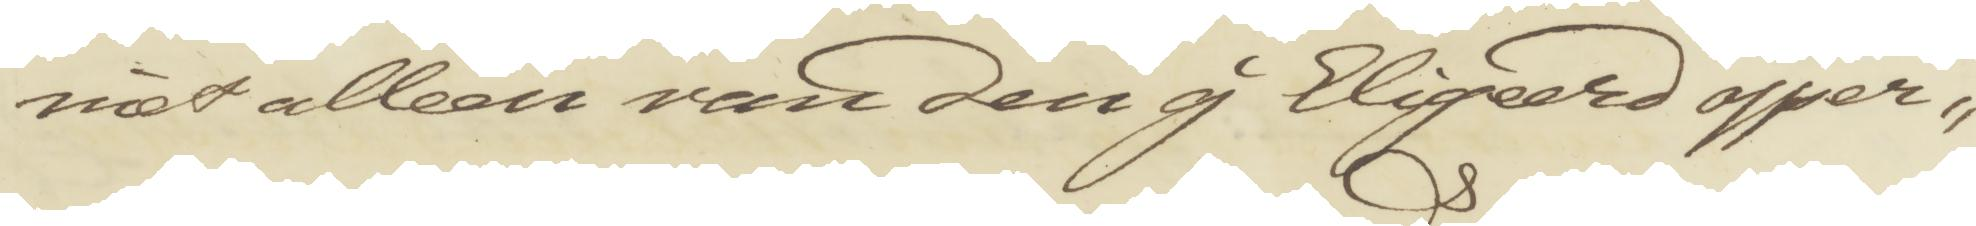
niet alleen van den g' Eligeerd opper„
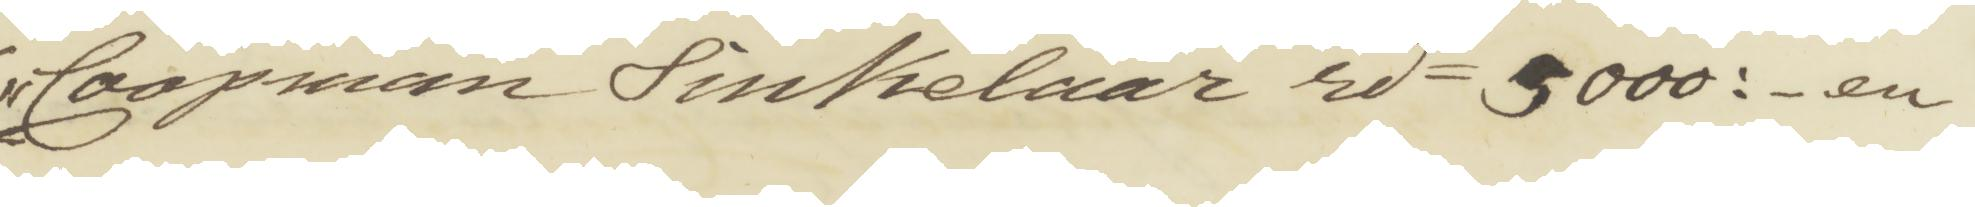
Coopman Sinkelaar rd=s 5000: - en
